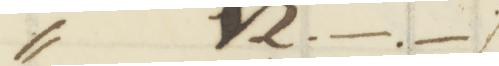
„ 12.—.—
